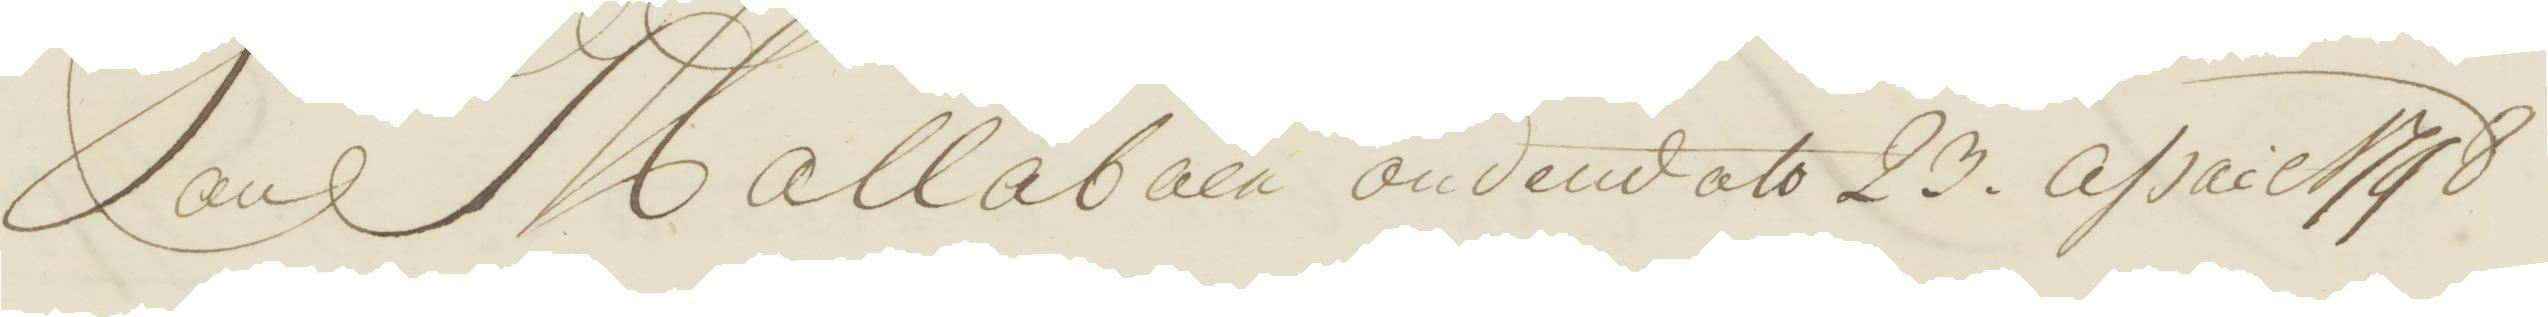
Van Mallabaer onder dato 23. april 1748
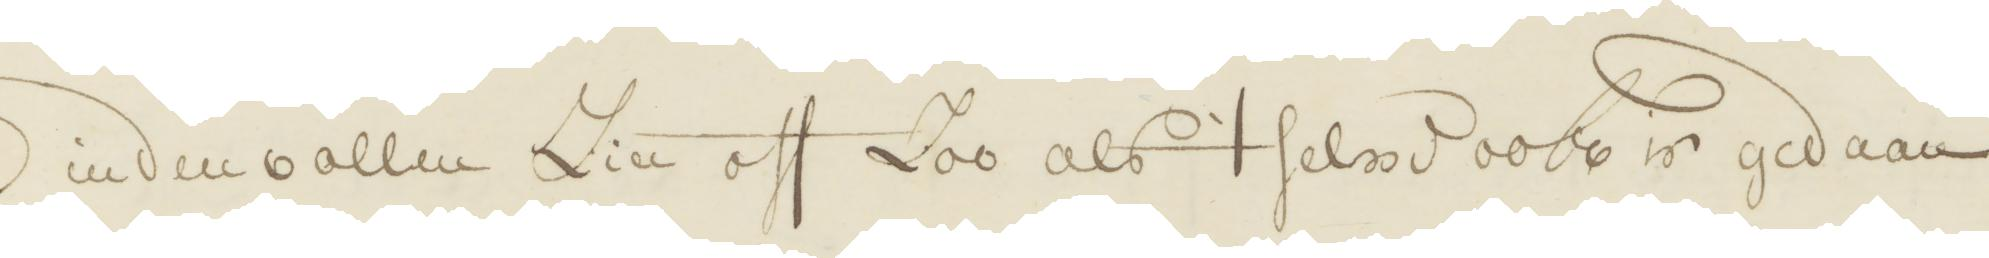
in den vollen zin off zoo als ’tselve ook is gedaan
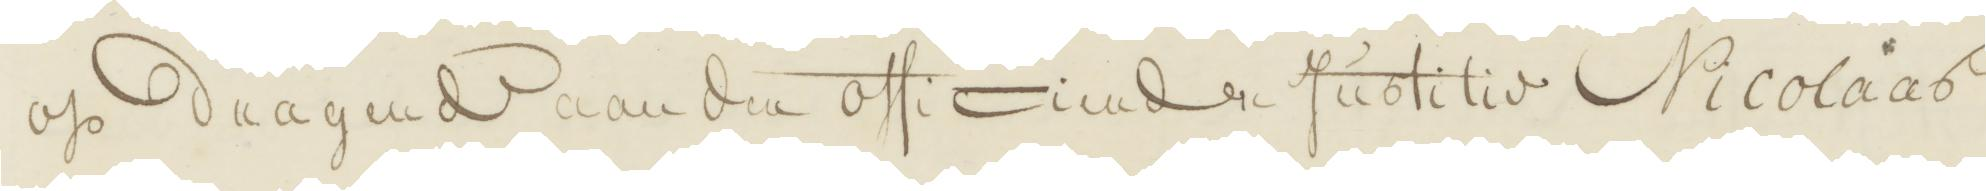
op dragende aan der officier der Justitie Nicolaas
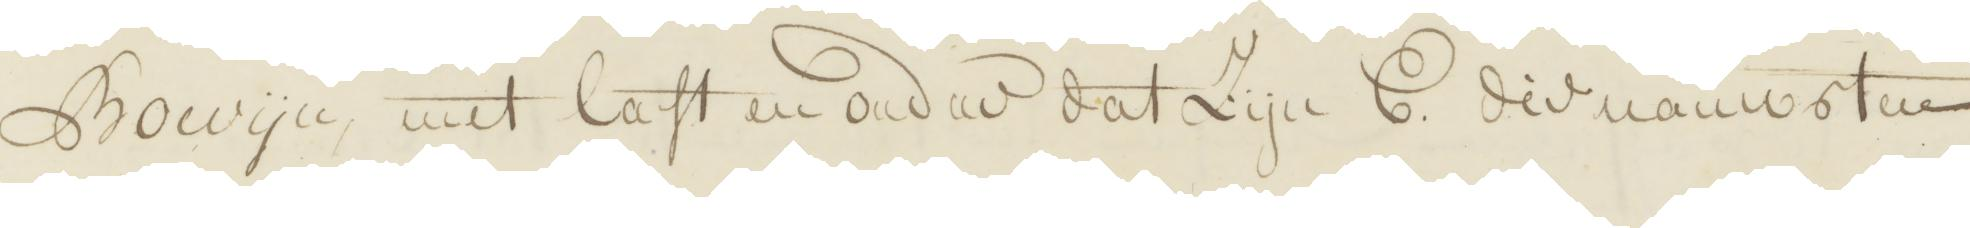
Bowijn, met last en ordre dat zijn E. die nauwsten
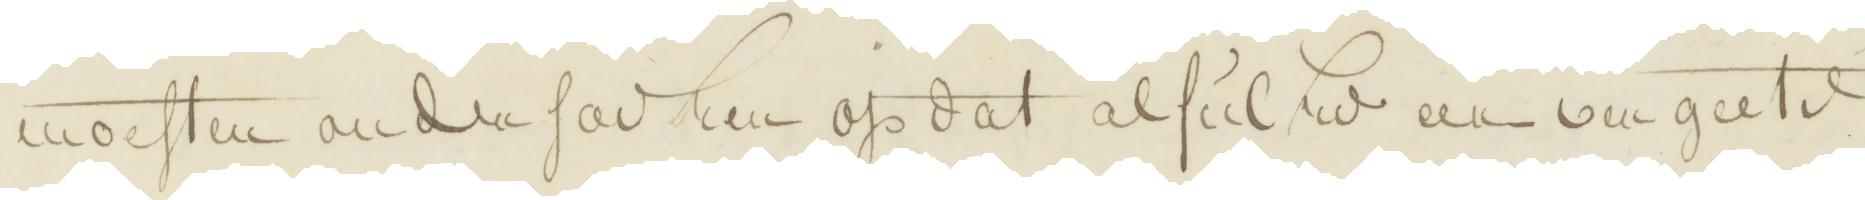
moesten ondersoeken op dat alsulke eer vergeete
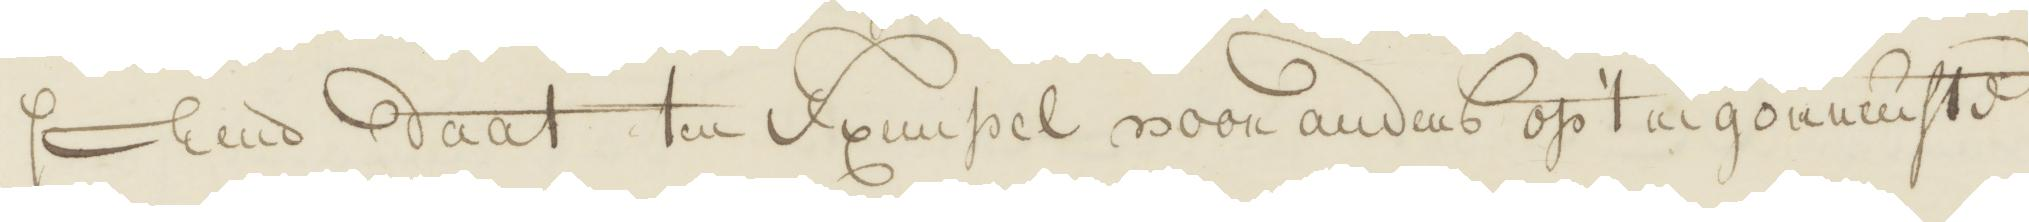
schend daat ten Exempel voor anders op ’t rigoureuste
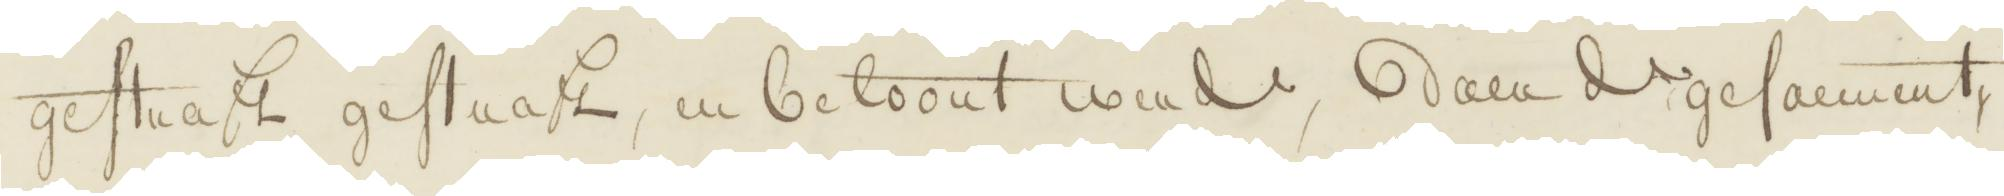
gestraft gestraft, en beloont werde, daer de gesaement„
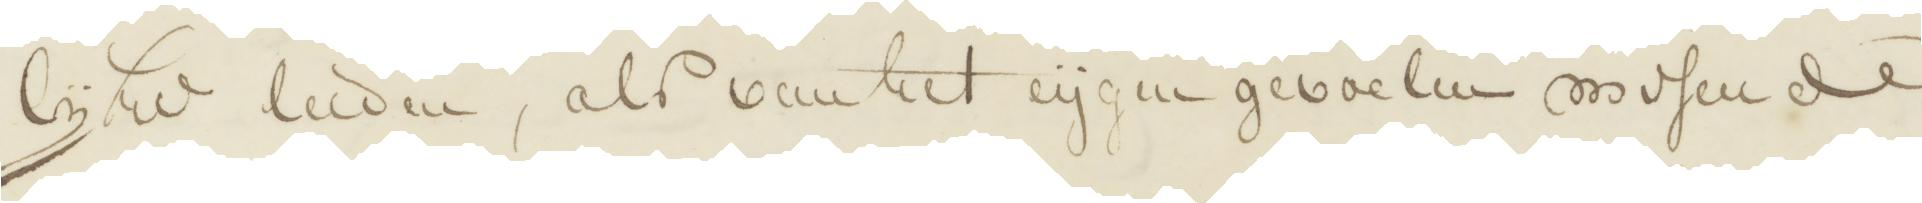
lijke leeden, als van het eijgen gevoelen wesen de
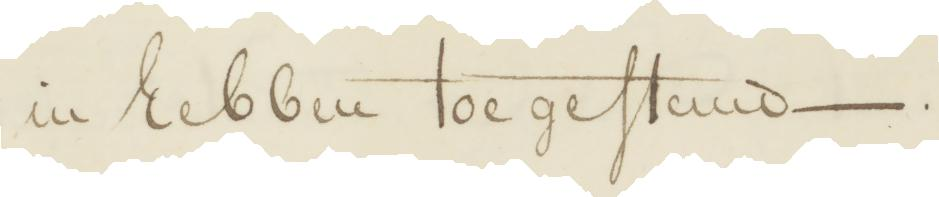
in hebben toe gestemd —.
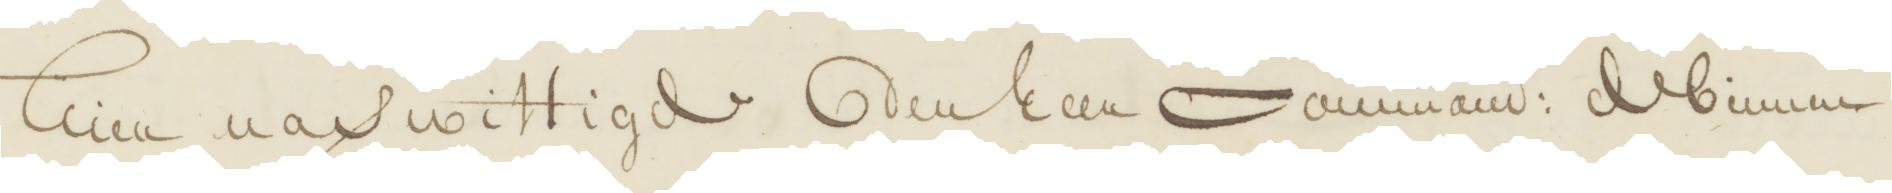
hier naverwittigde den heer command:r debinnen
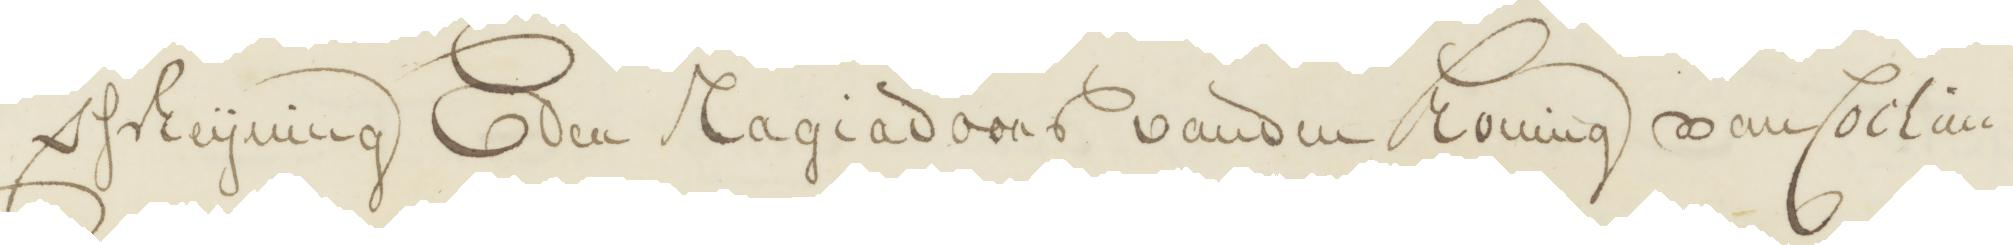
verscheijning den ragiadoors van den koning van Cochim
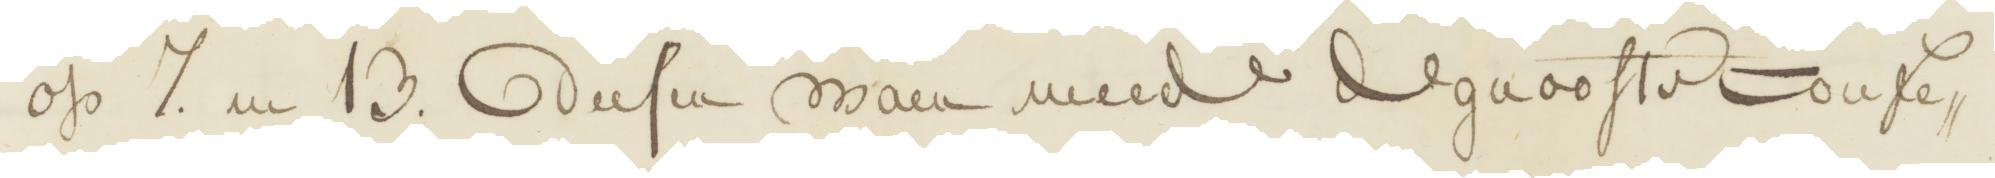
op 7. in 13. deeser waer meede de grooste confe„
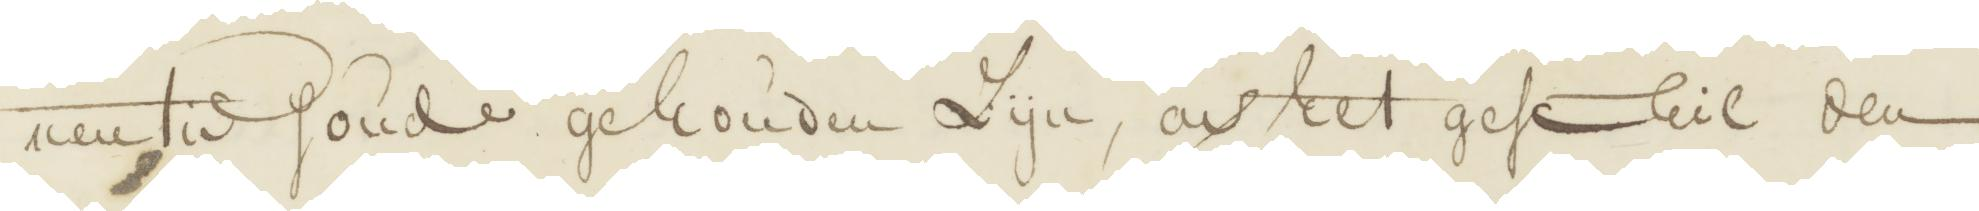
rentie soude gehouden zijn, over het geschil der
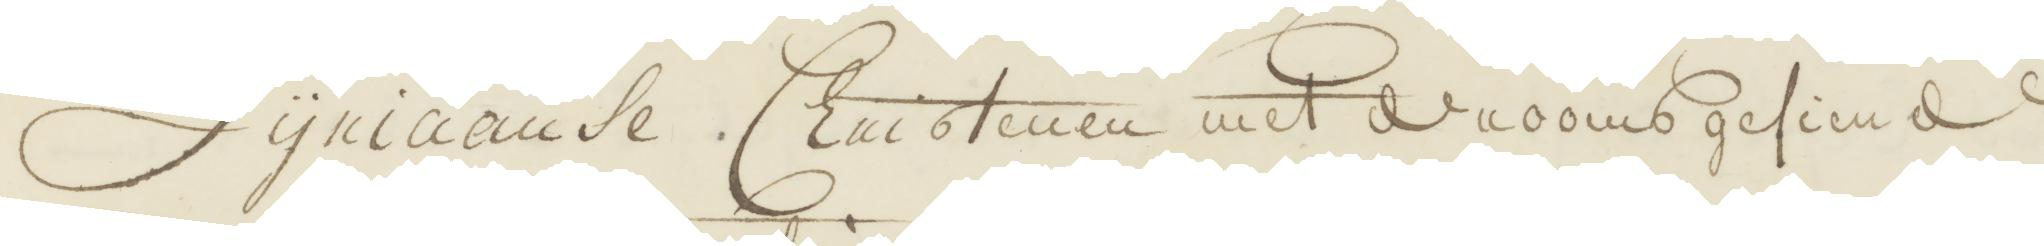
Sijriaanse Christenen met de rooms gesiende
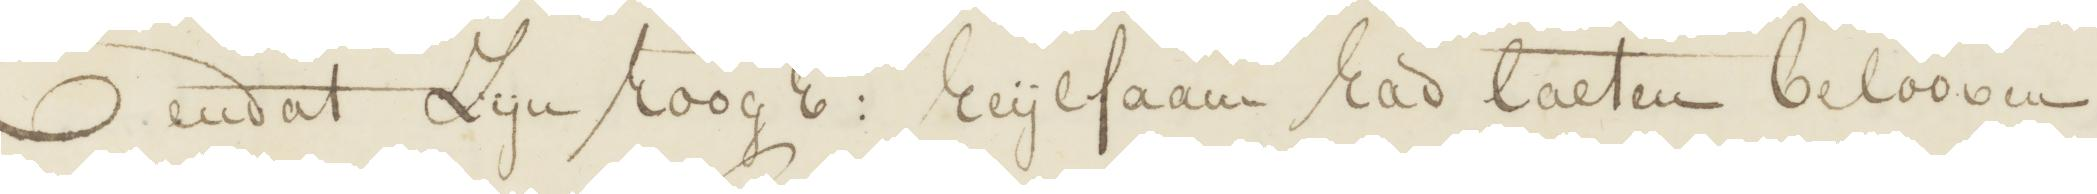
endat zijn hoog E:t heijlsaam had laeten belooven
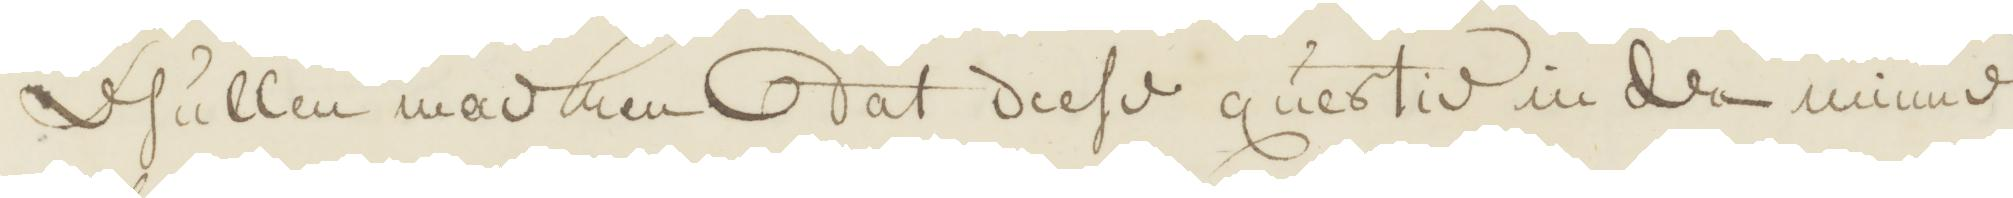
tesullen maeken dat deese questie in der minne
